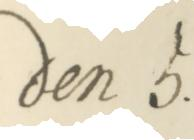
den 5.
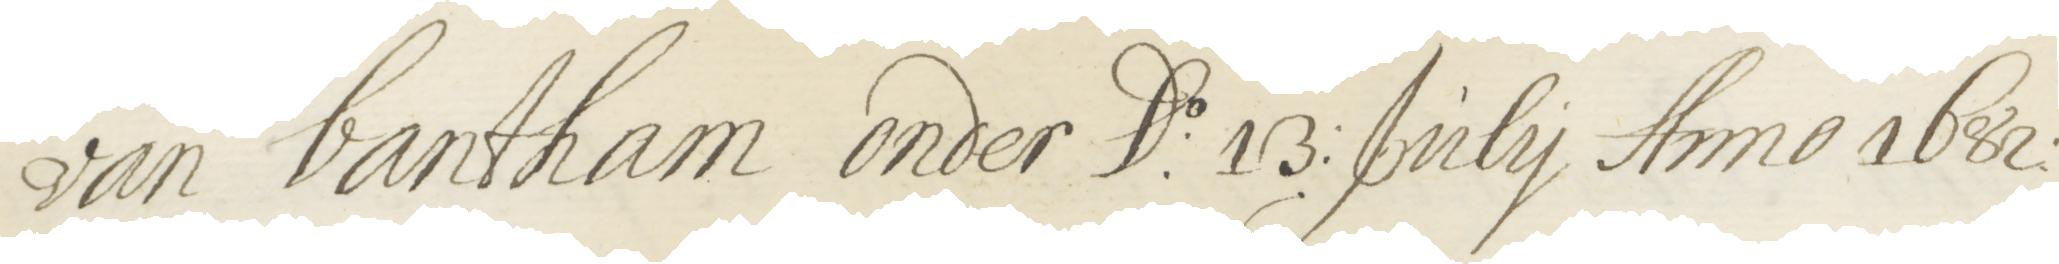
van bantham onder D:o 13: Julij Anno 1682:
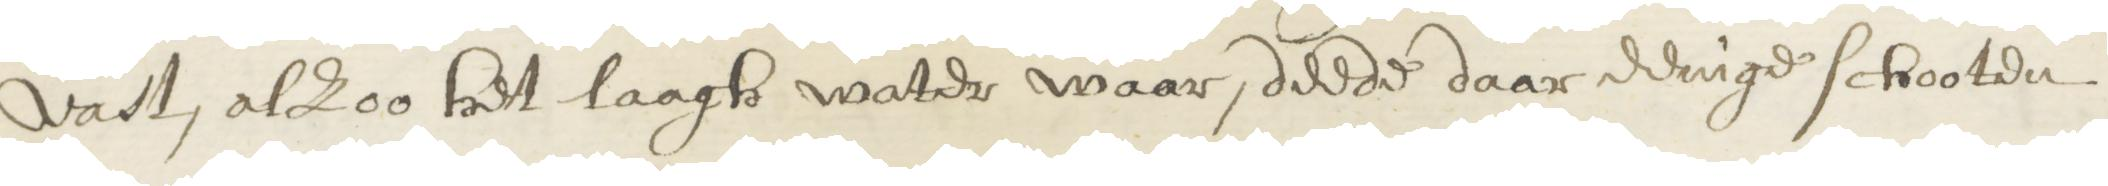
Vast, alzoo het laagh water waar, deede daar eenige schooten
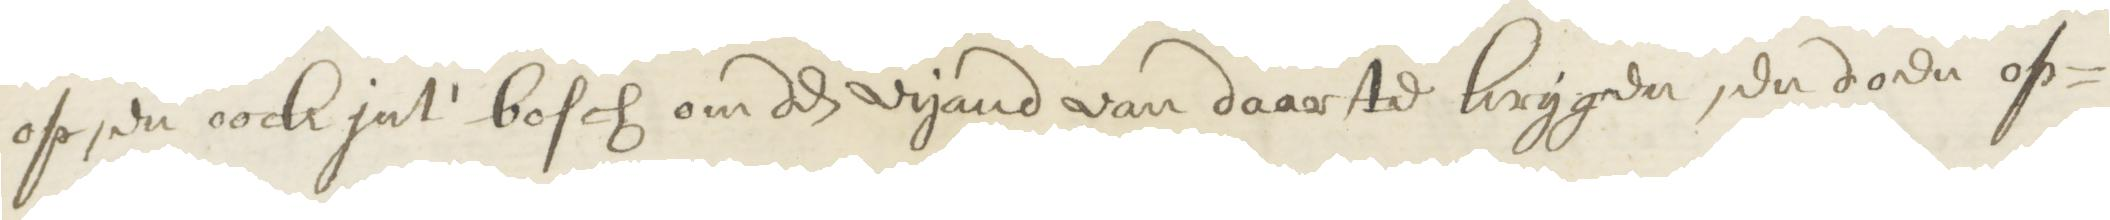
op, en oock int' bosch om den vijand van daar te krijgen, en doen op=
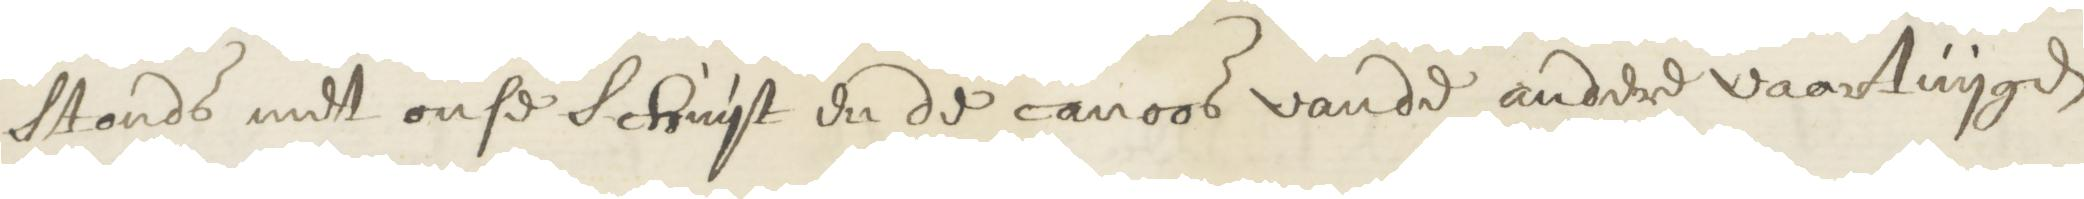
stonds met onse schuijt en de canoos vande andere vaartuijgen
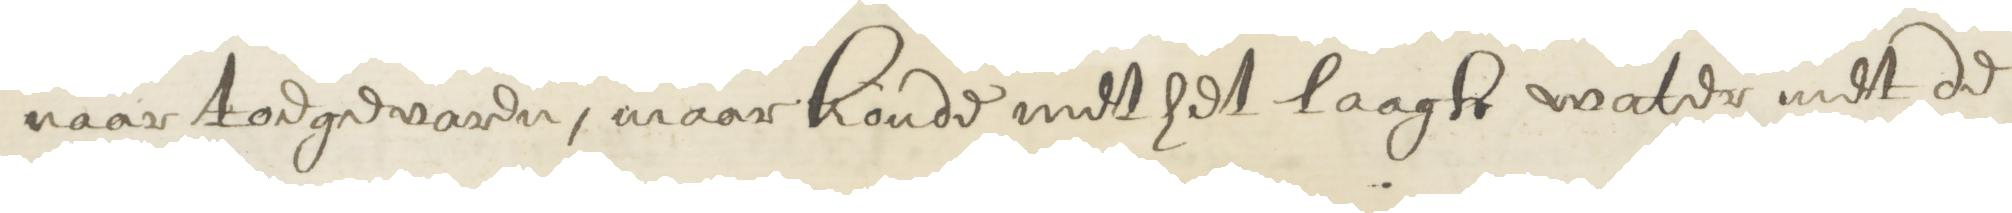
naar toegevaren, maar konde met het laagh water met de
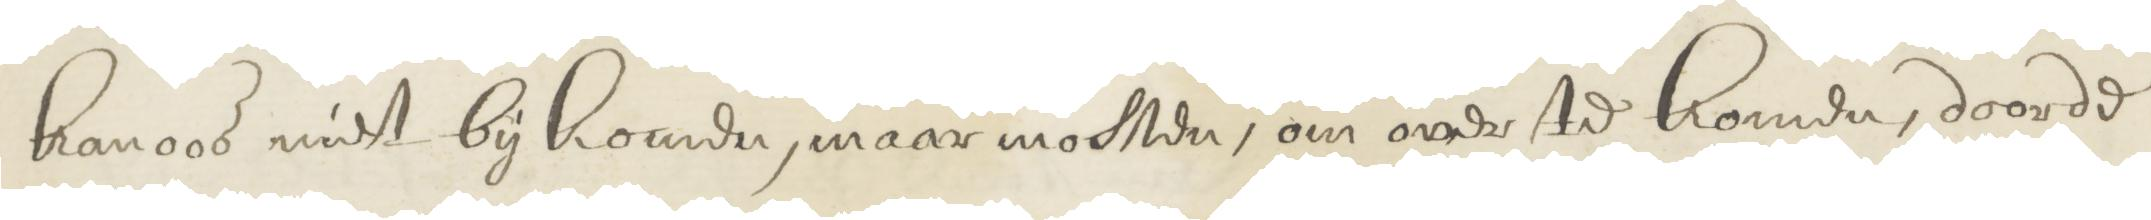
kanoos niet bij komen, maar mosten, om over te komen, door de
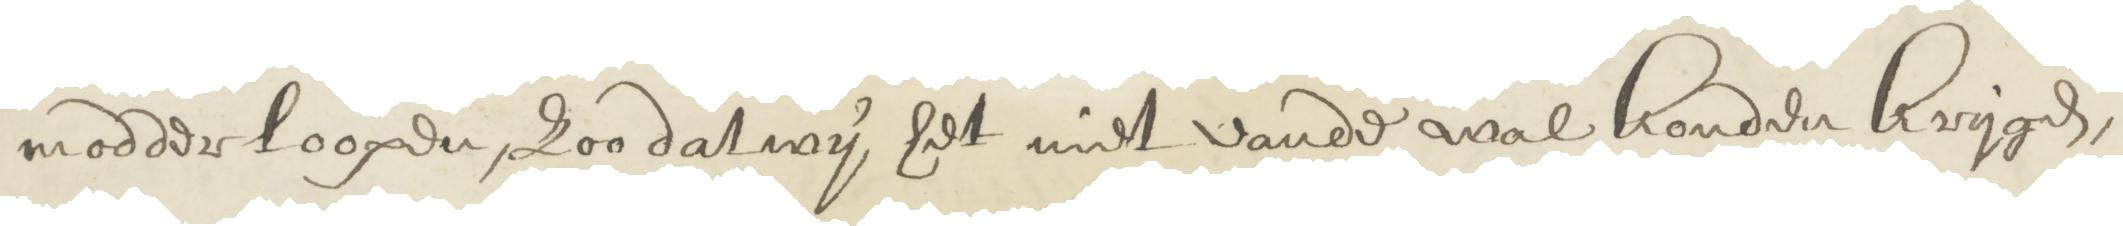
modder loopen, zoo dat wij het niet vande wal konden krijgen,
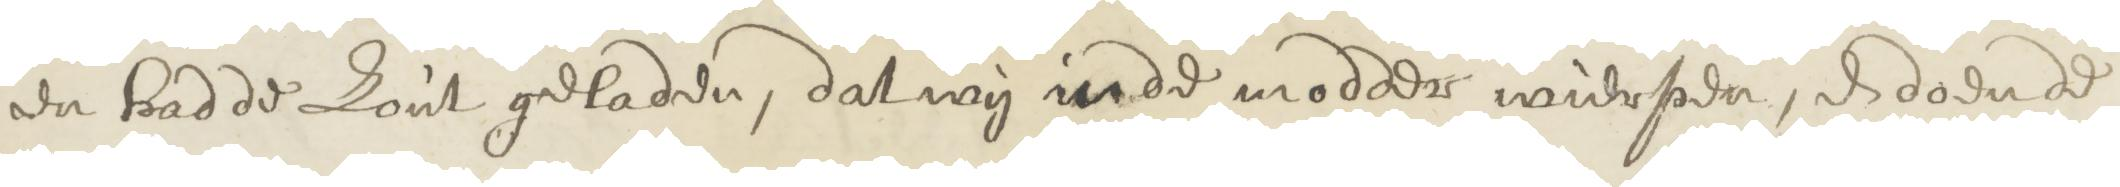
en hadde zout geladen, dat wij inde modder wierpen, en doen de
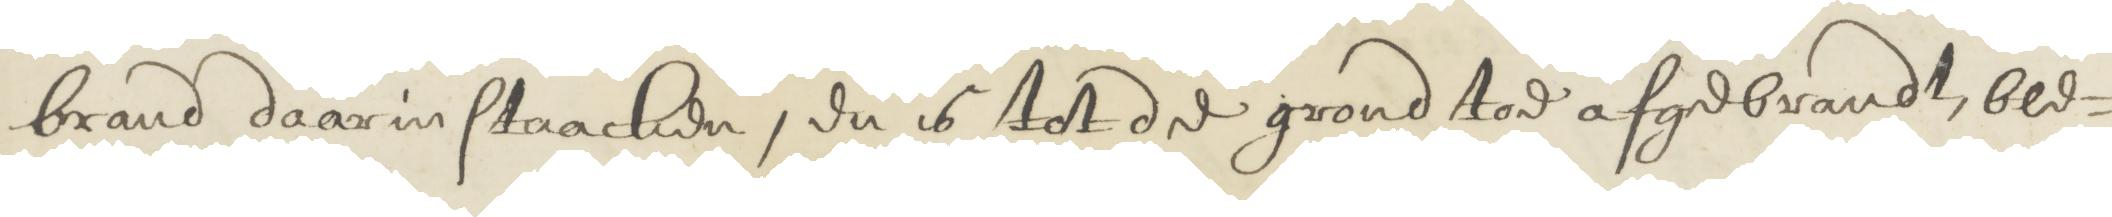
brand daar in staacken, en is tot de grond toe afgebrandt, ble=
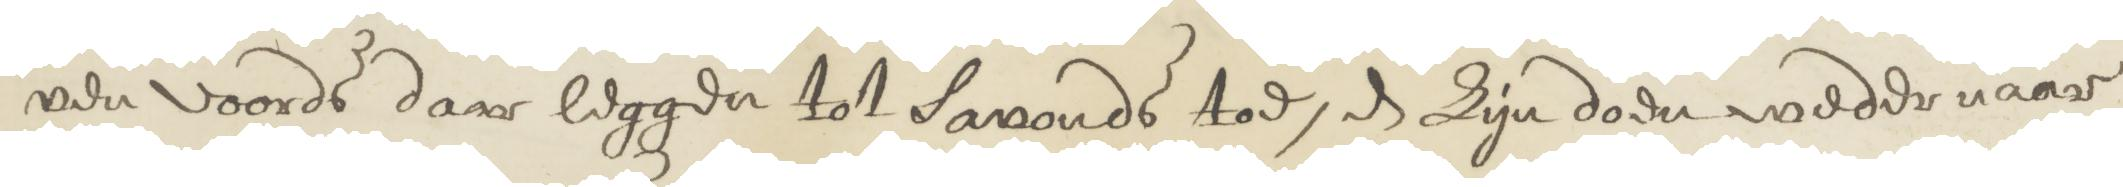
ven voords daar leggen tot savonds toe, en zijn doen weder naar
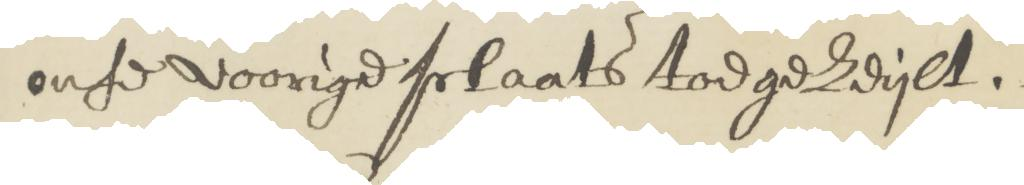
onse voorige plaats toe gezeijlt.
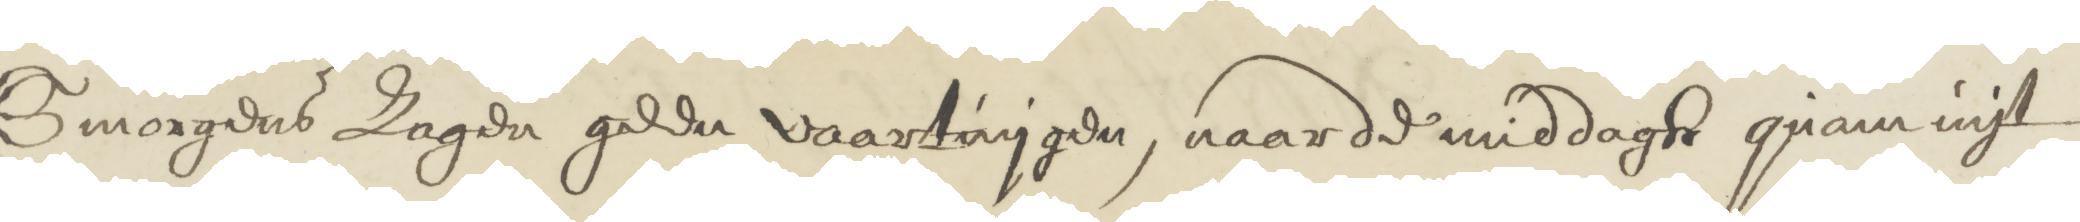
Smorgens zagen geen vaartuijgen, naar de middagh quam uijt
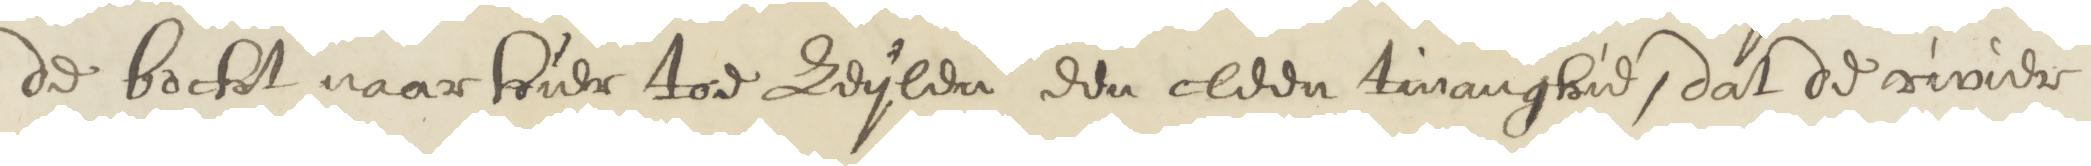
de bocht naar hier toe zeijlen een cleen tinanghie, dat de rivier
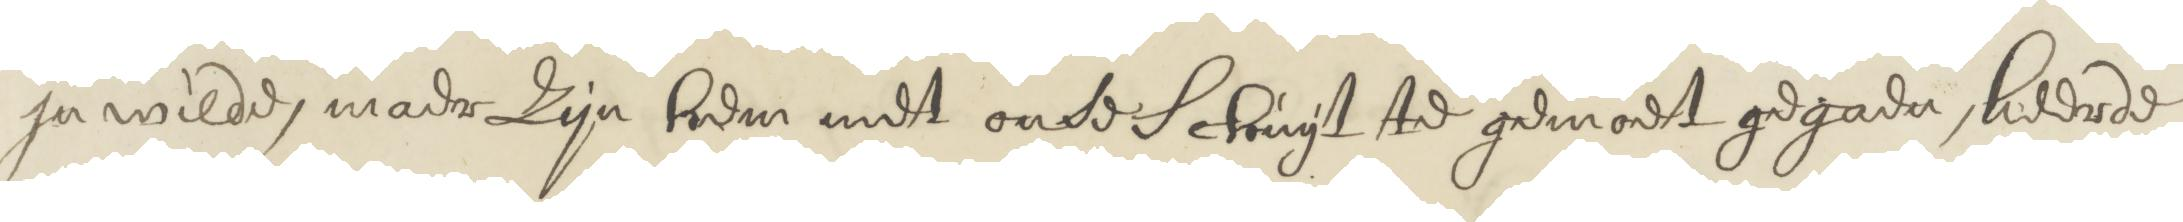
in wilde, maer zijn hem met onse schuijt te gemoet gegaen, keerde
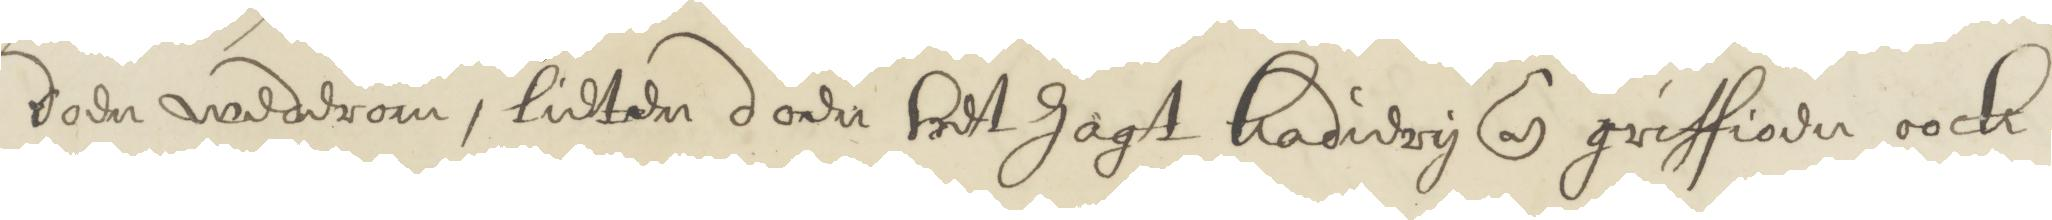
doen wederom, lieten doen het Jagt kadierij ende griffioen oock
